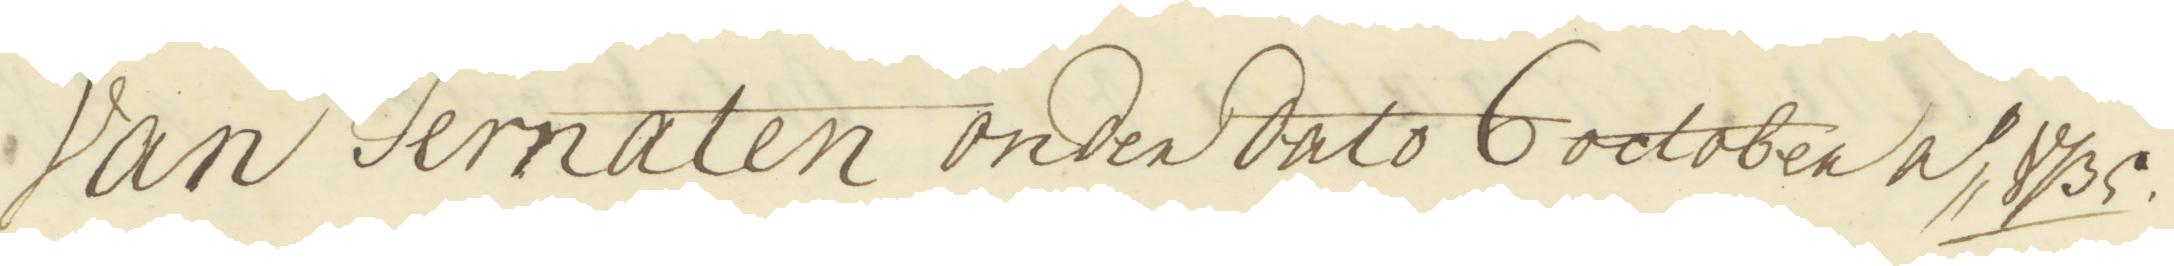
Van Ternaten onder dato 6 october a„o 1735.
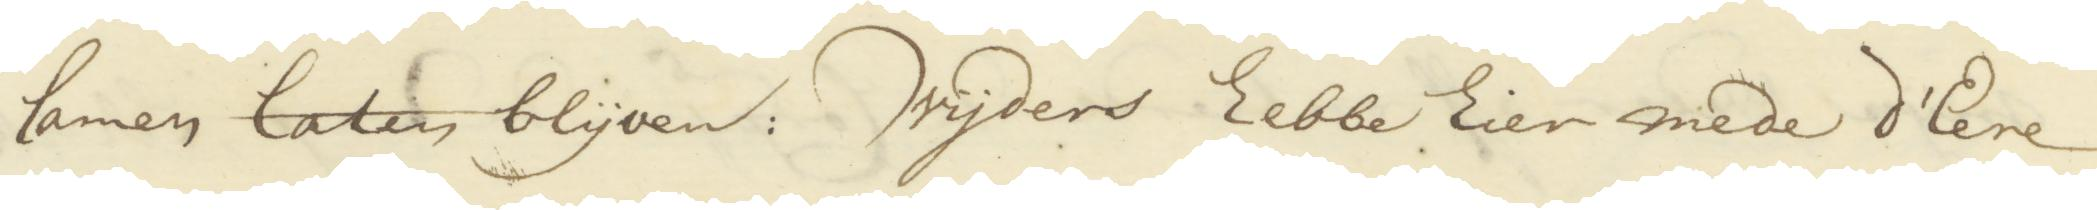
samen laten blijven: wijders hebbe hier mede d’Eere
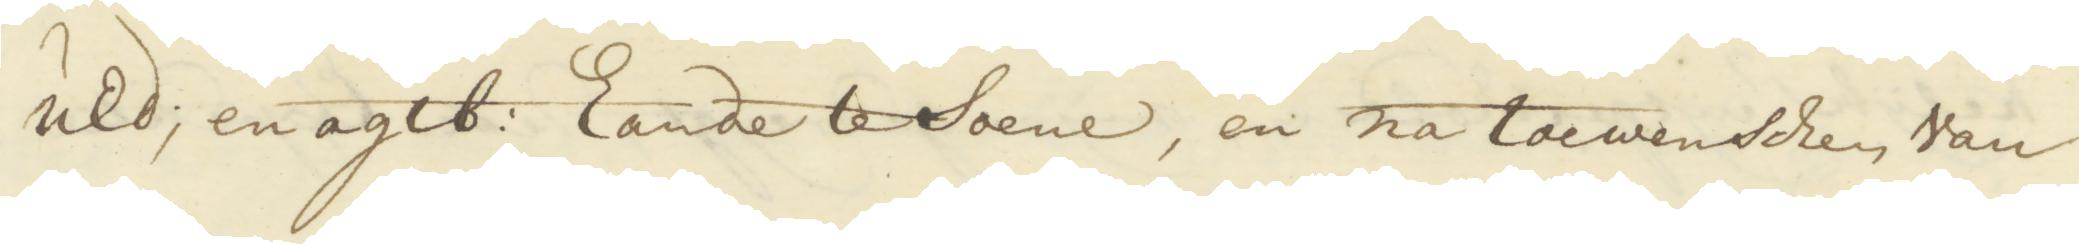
uEd; en agtb: hande te soene, en na toewenschen van
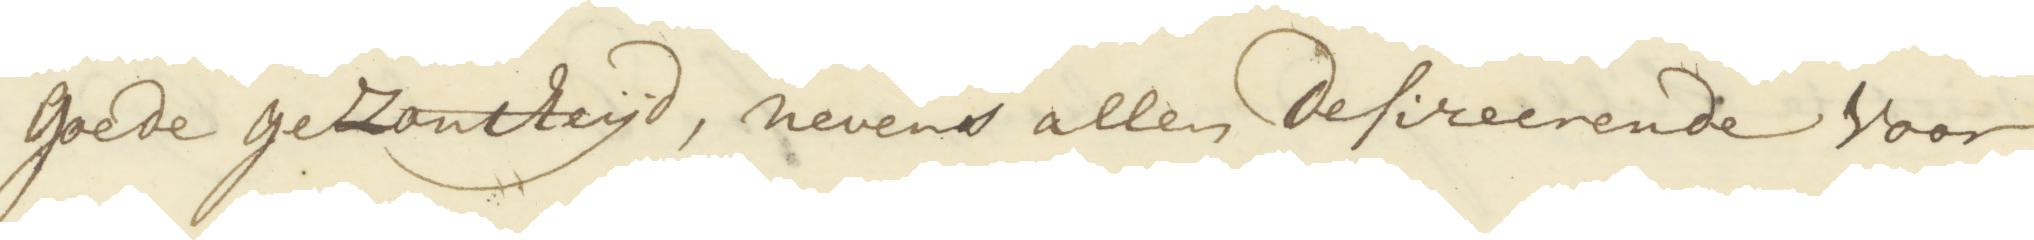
goede gezontheijd, nevens allen desireerende voor
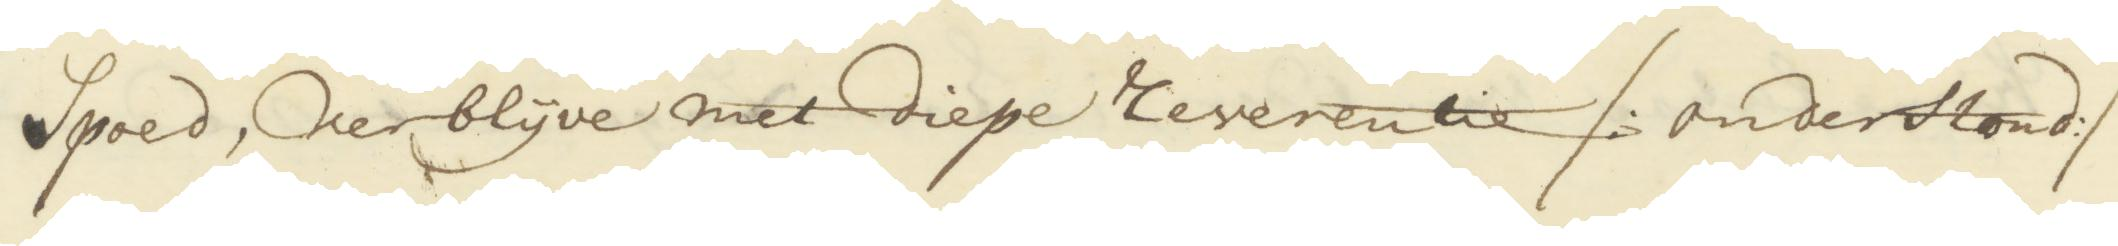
spoed, verblijve met diepe reverentie /: onderstond:/
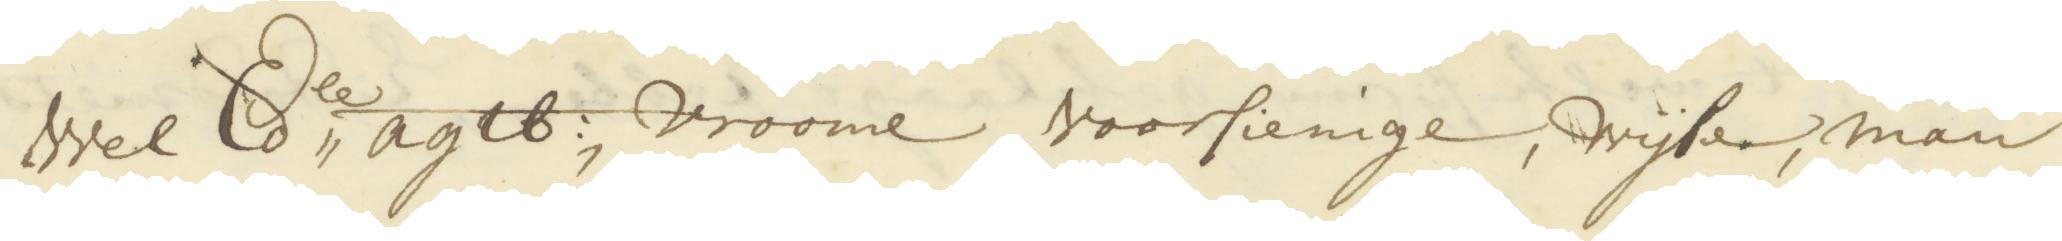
Wel Ed„le agtb:, vroome, voorsienige, wijse, man
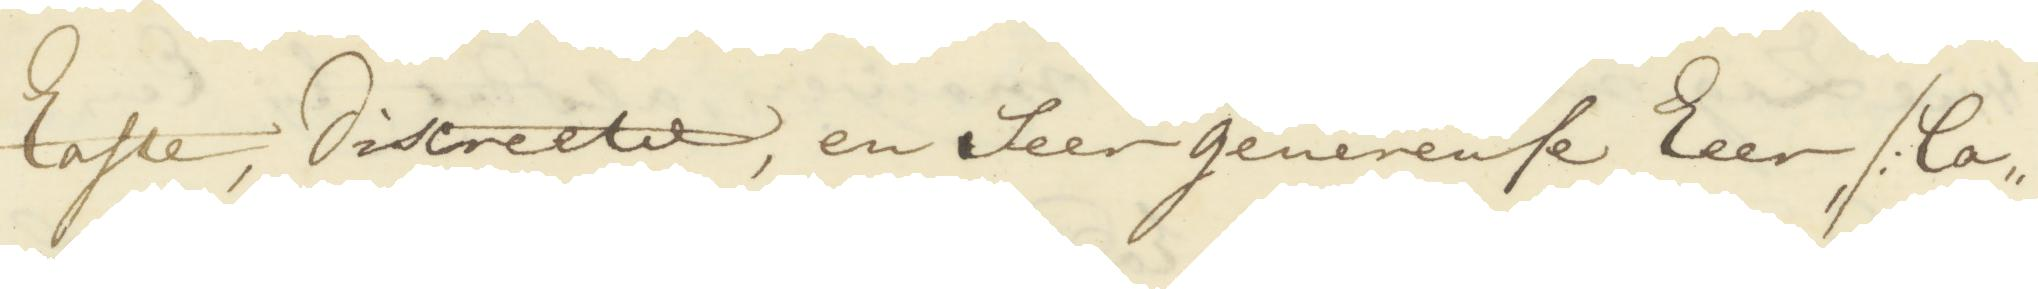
hafte, discreete, en seer genereuse heer,/:la„
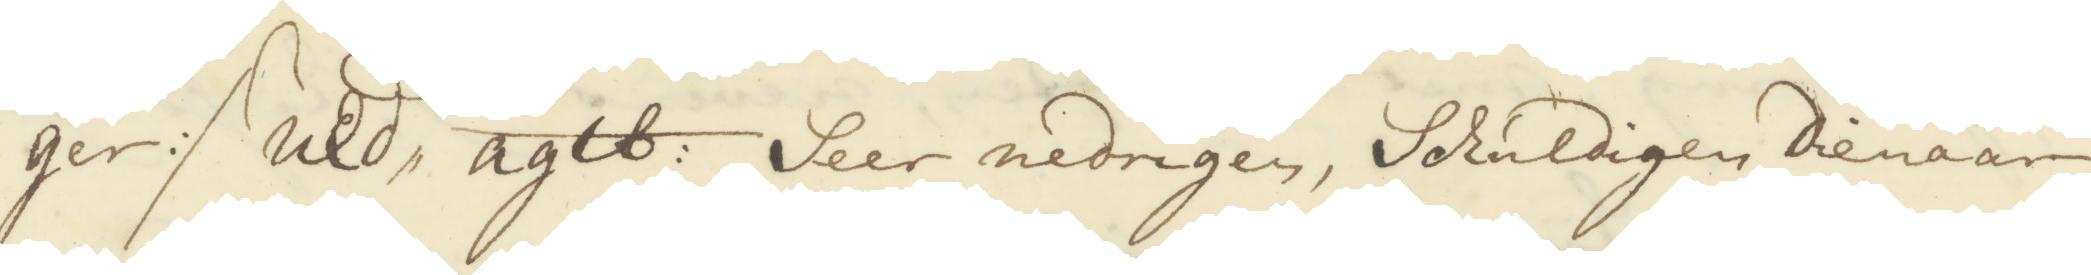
ger:/ uEd„le agtb: seer nedrigen, schuldigen dienaar,
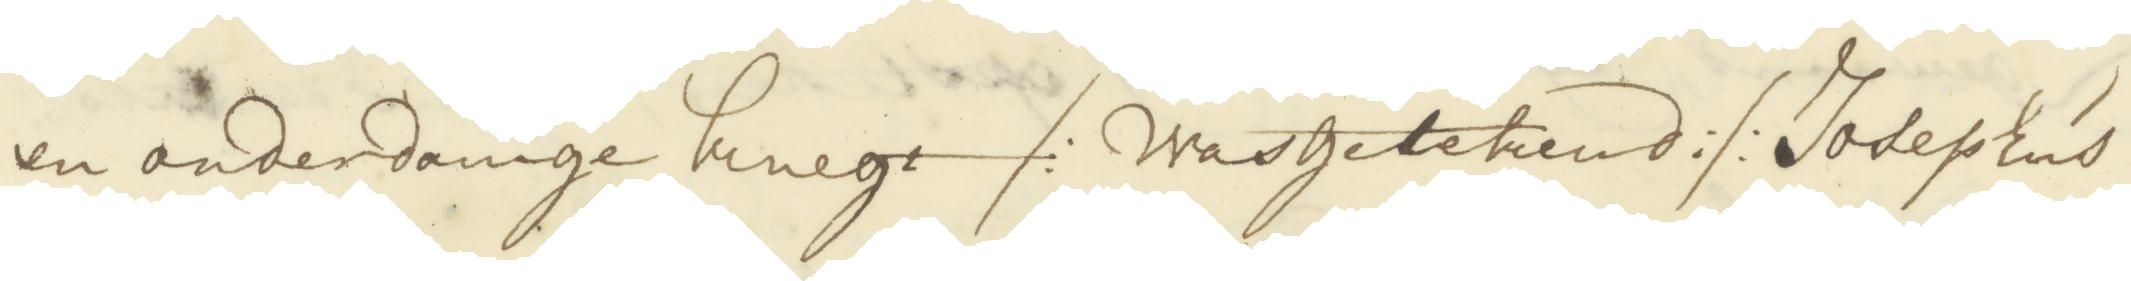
en onderdanige knegt /: was getekend :/: Iosephus
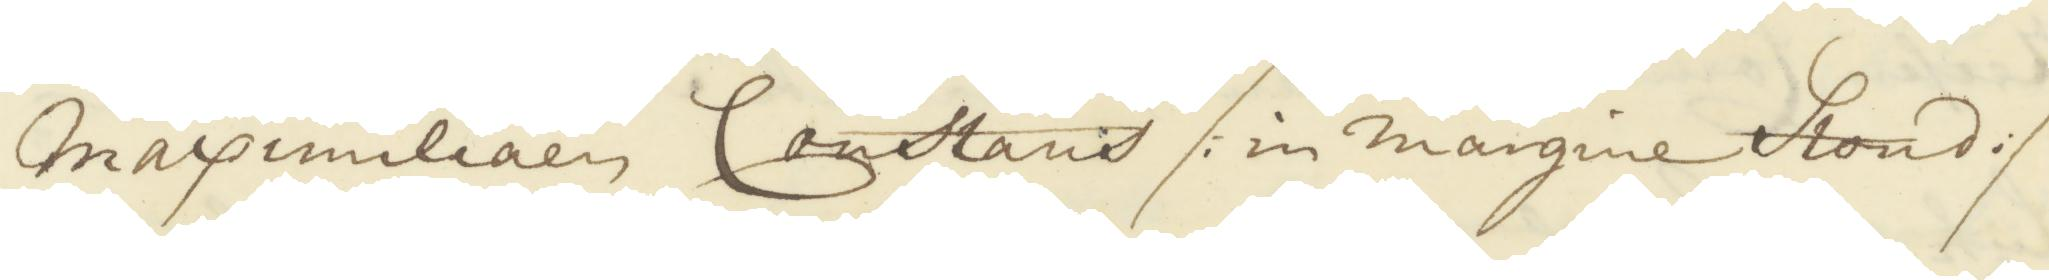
maximiliaen Constans /: in margine stond :/
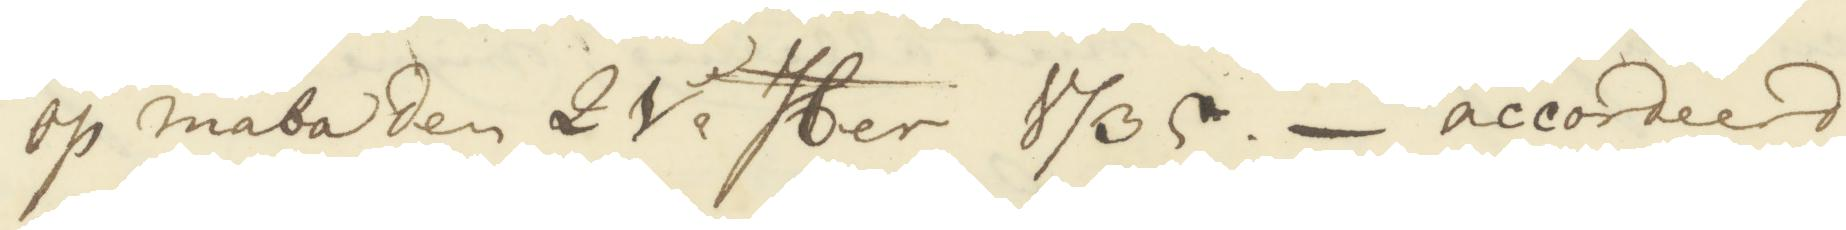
op maba den 21:e 7ber 1735. — accordeerd
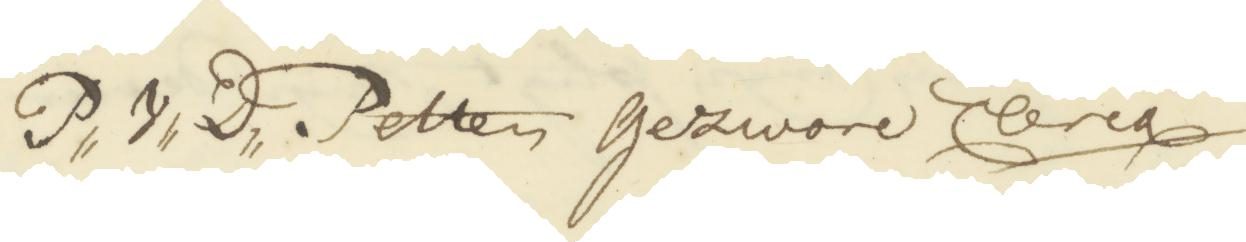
P„ V„ D„ Petten gezwore Clercq
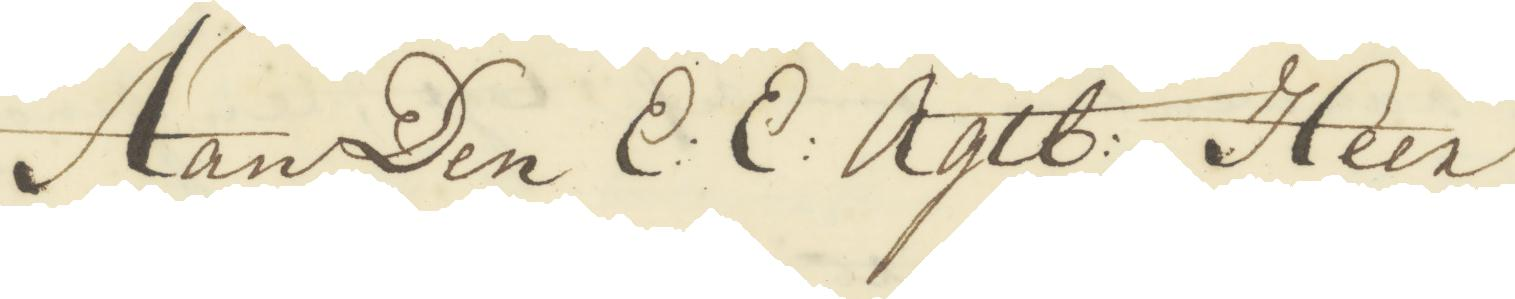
Aan Den E: E: Agtb: Heer
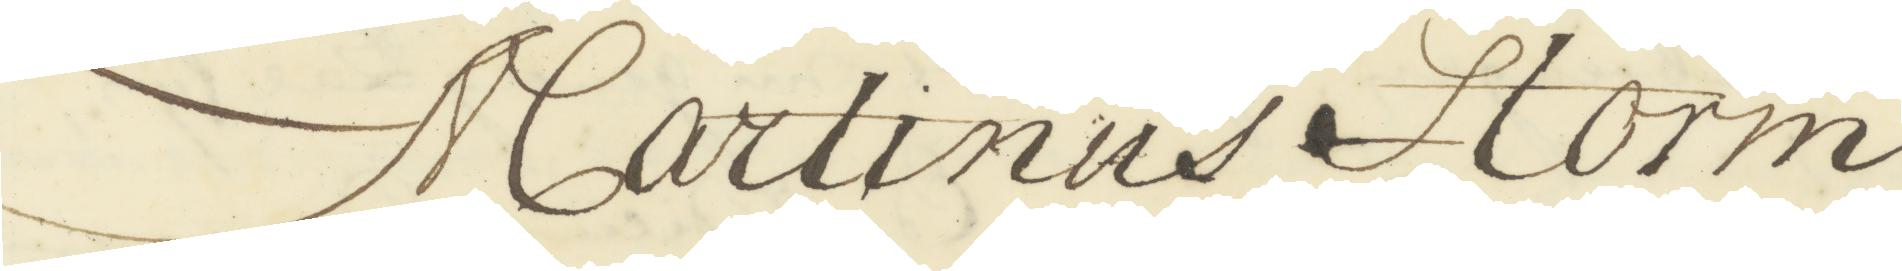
Martinus Storm
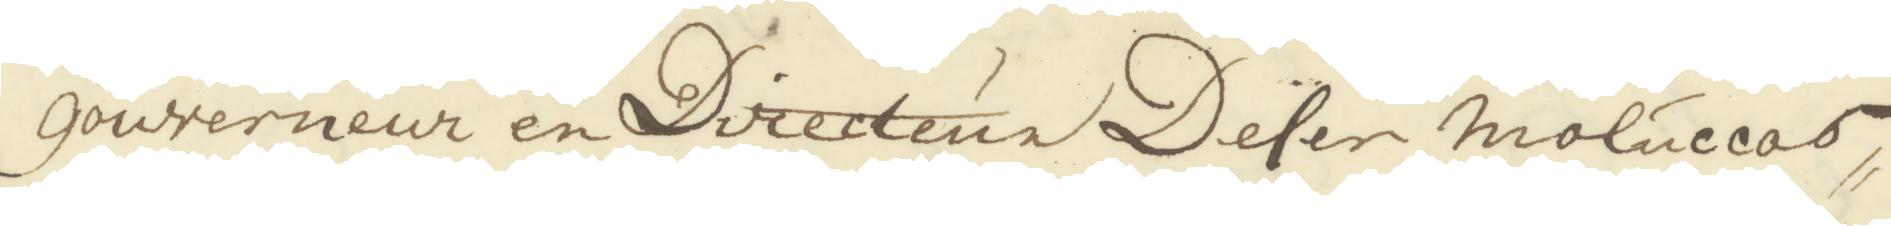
gouverneur en Directeur Deser moluccas„
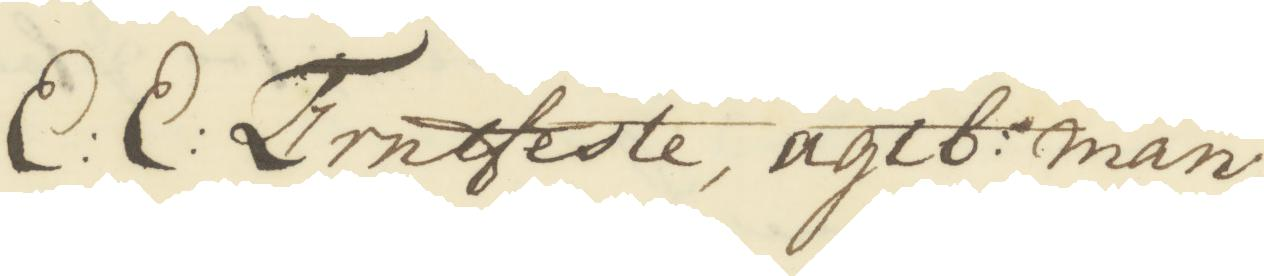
E: E: Erntfeste, agtb: man
